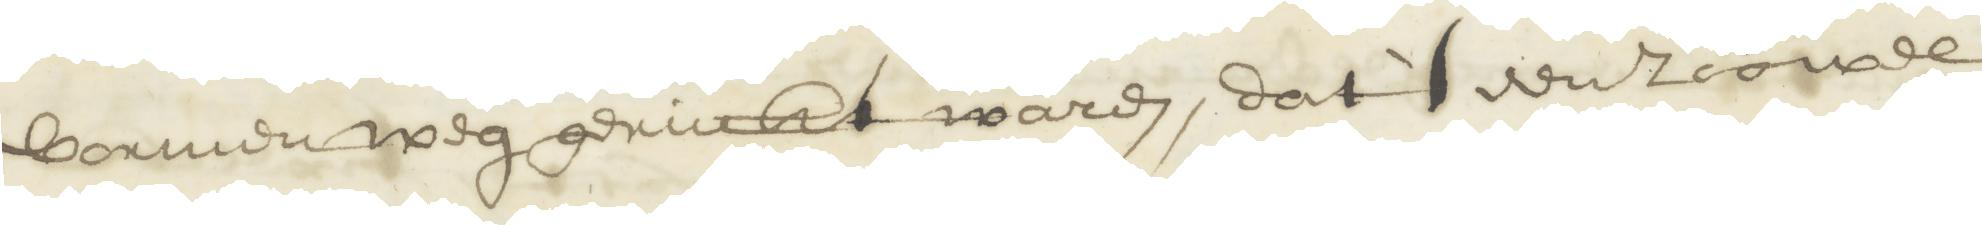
wormen weg geruckt waren, dat ’t een zoowel
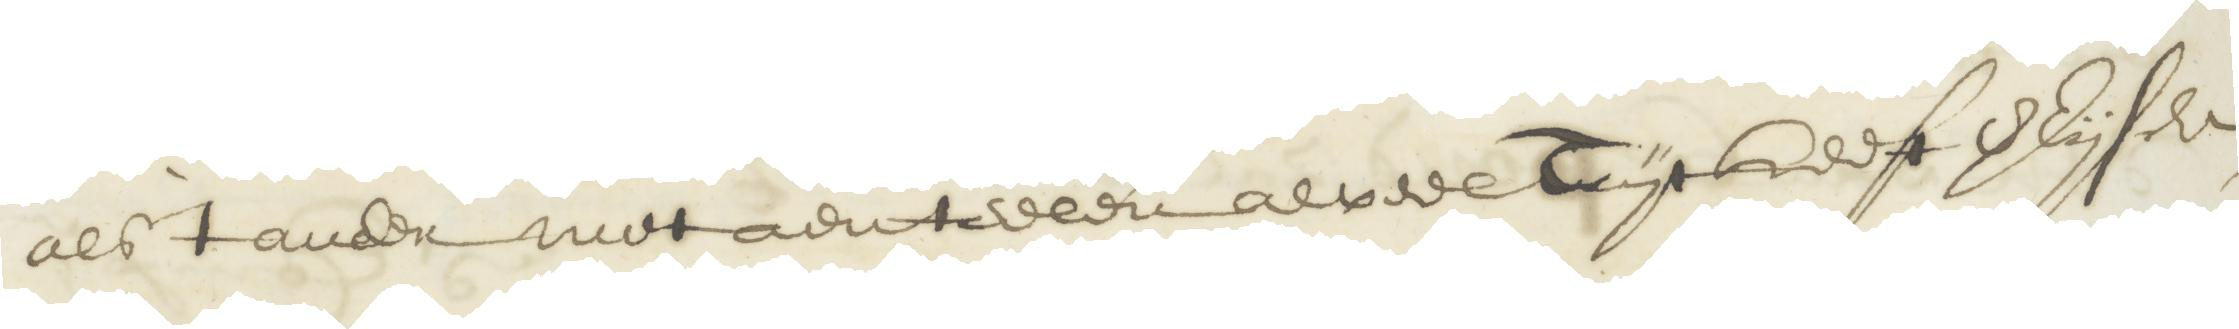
als 't ander met aenteelen alveel tijt heeft verEijscht
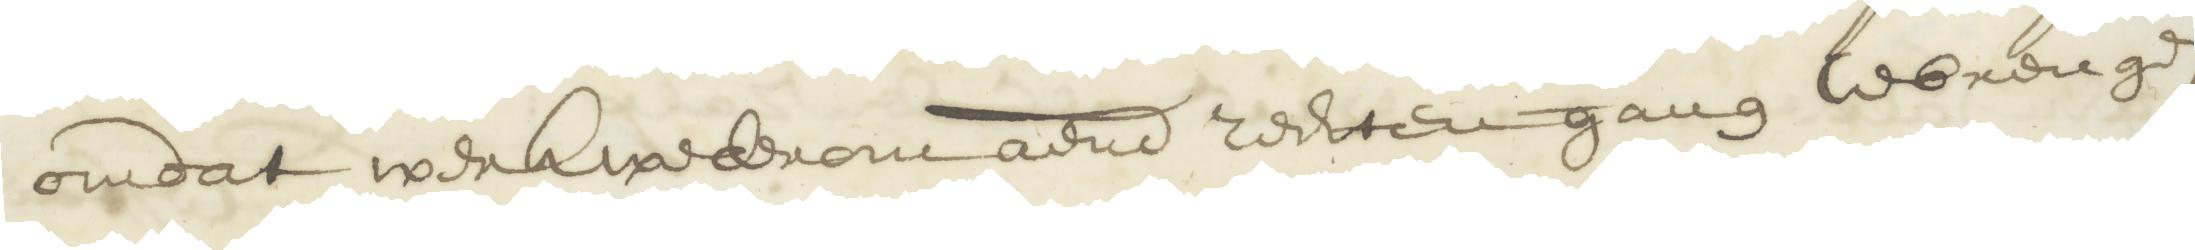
omdat werk wederom aend rechten gang te brengen
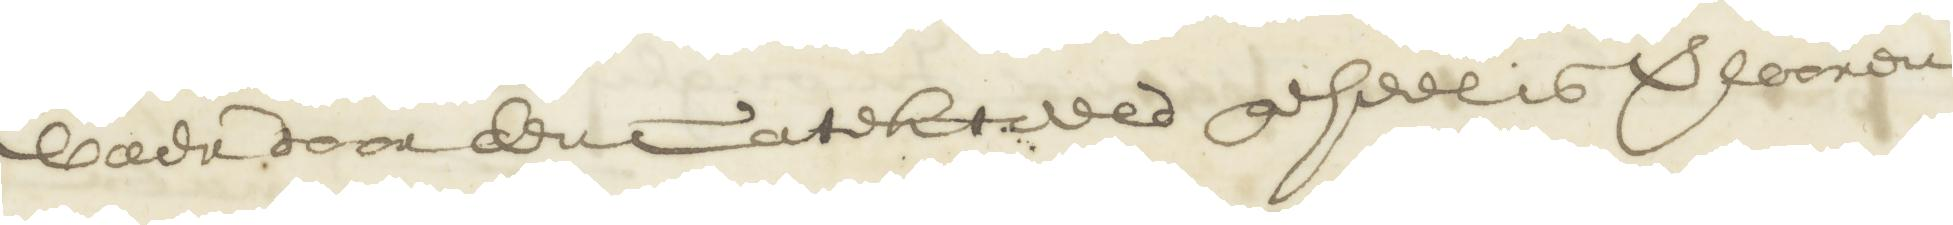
waer door den catekteeld geheel is verlooren
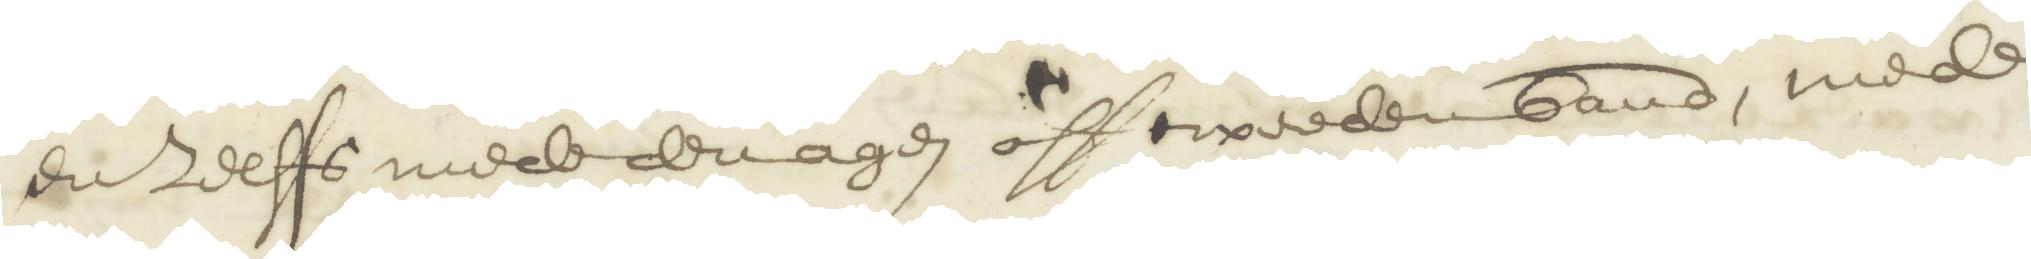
en zelffs mede den agen off tweeden band, mede
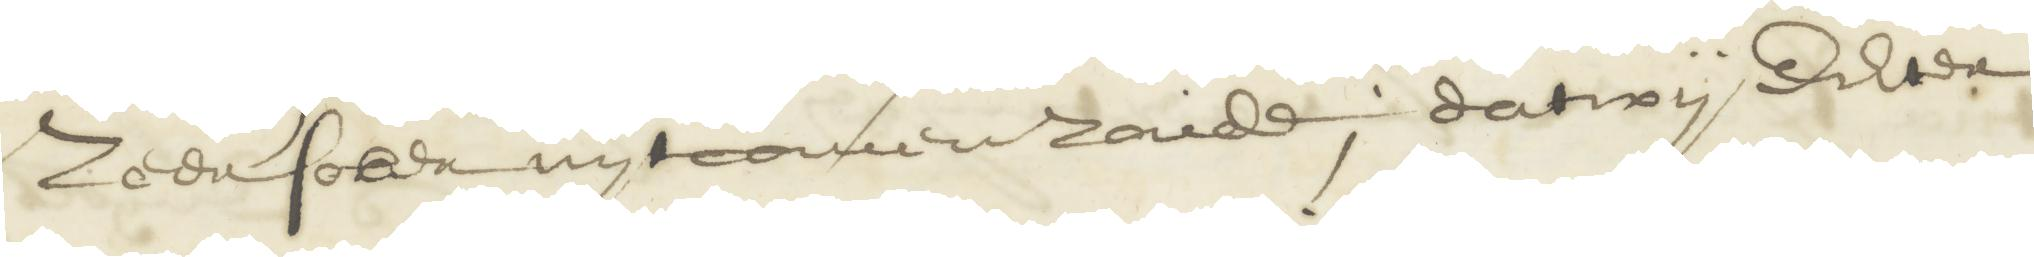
Zeer sober uijtcomen zoude; dat wij Echter
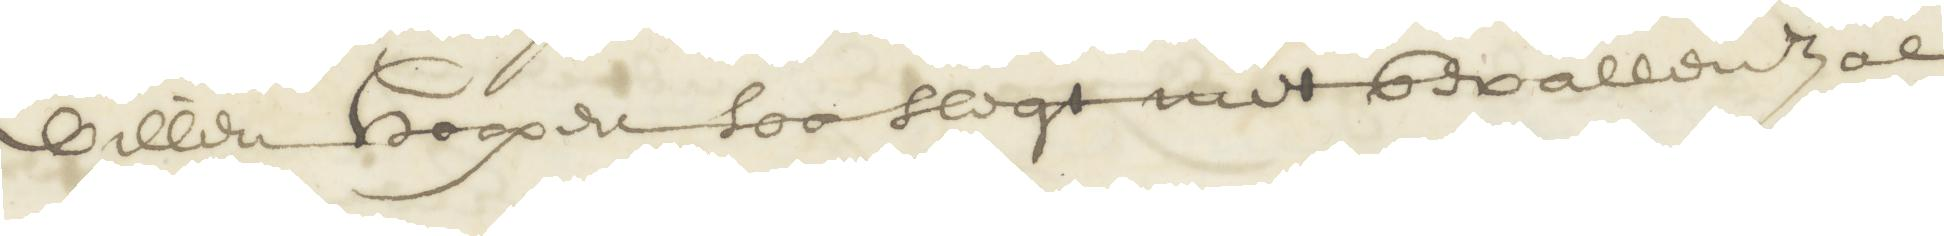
willen hoopen soo slegt niet bevallen Zal
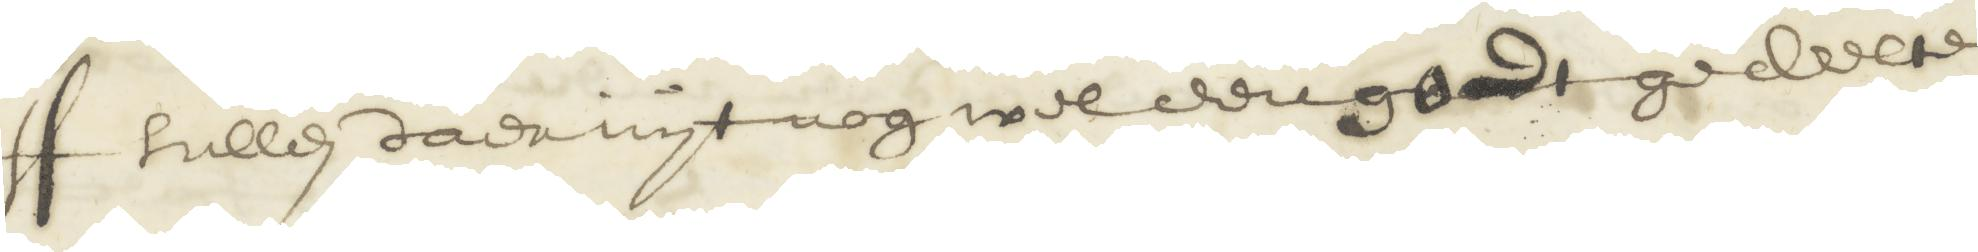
off sullen daeruijt nog wel een goet gedeelte
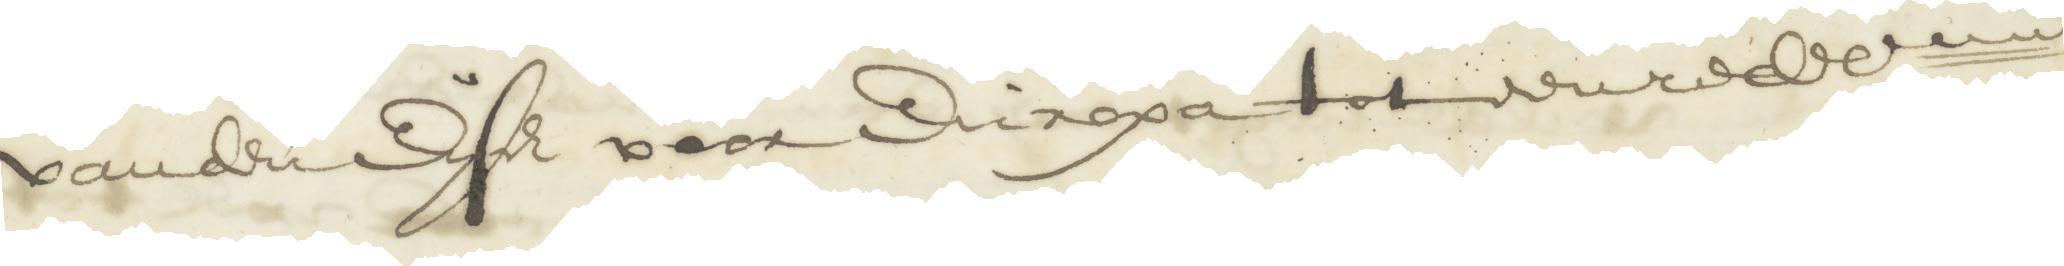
van den Eisch voor Europa tot een redelijke
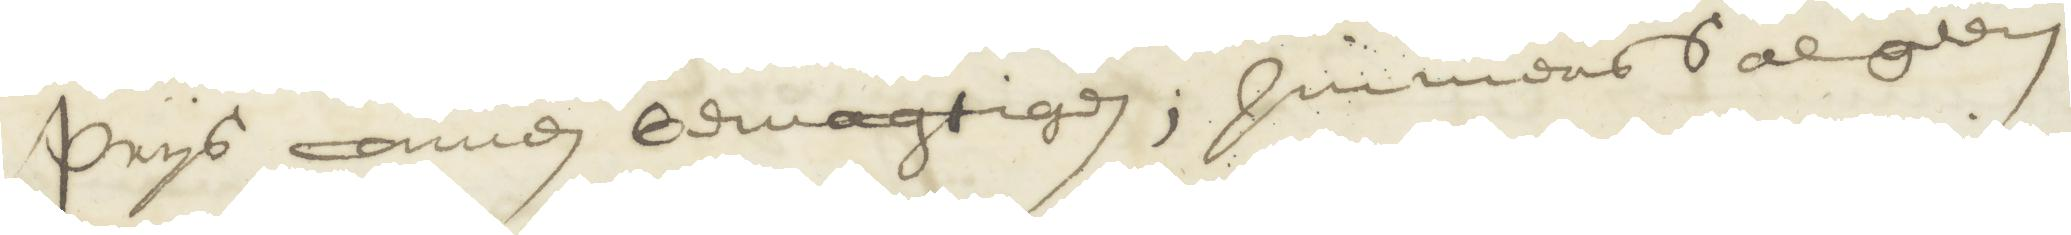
prijs connen bemagtigen; Jmmers sal geen
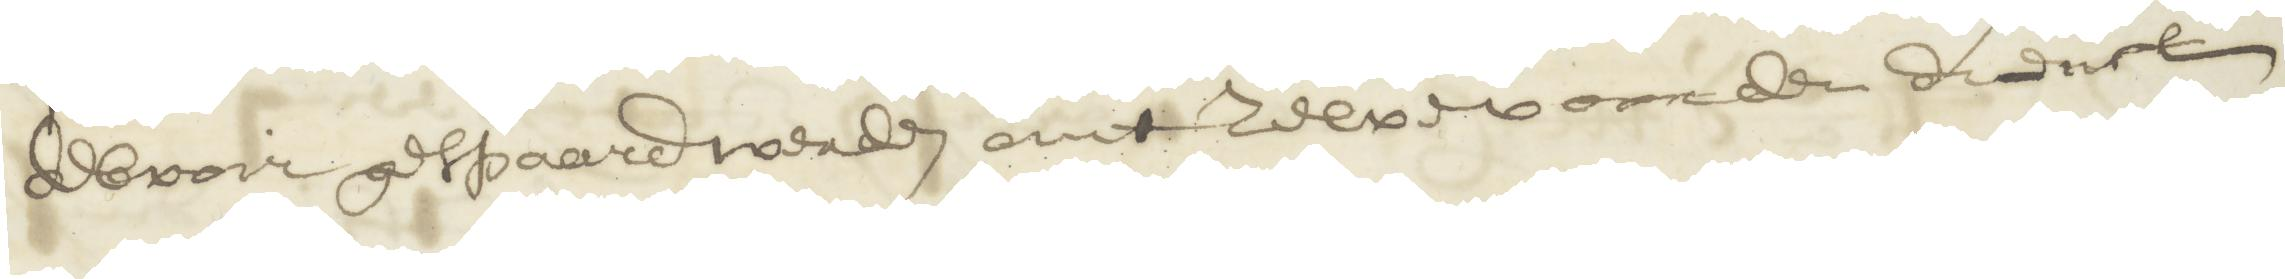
debvoir gespaard werden om’t zelve voor den dienst
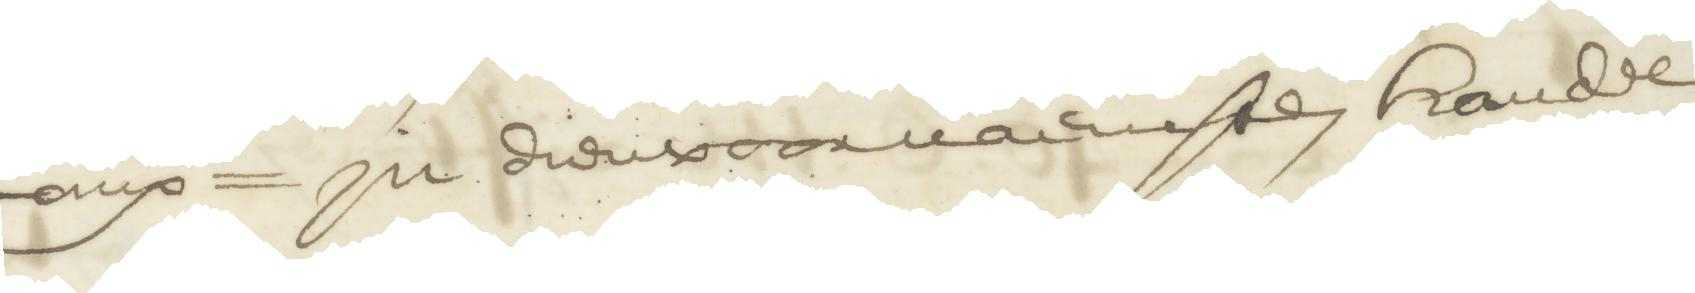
van d'E Comp=e jn dien voornaemsten handel
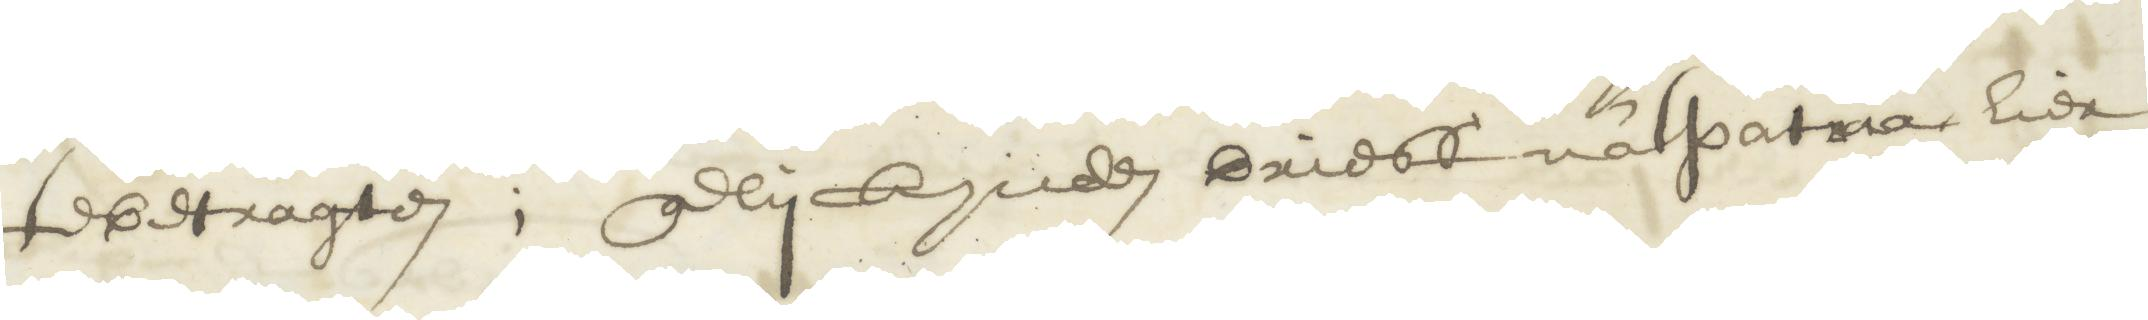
te betragten; gelijck jnden brieff na 't patria hier
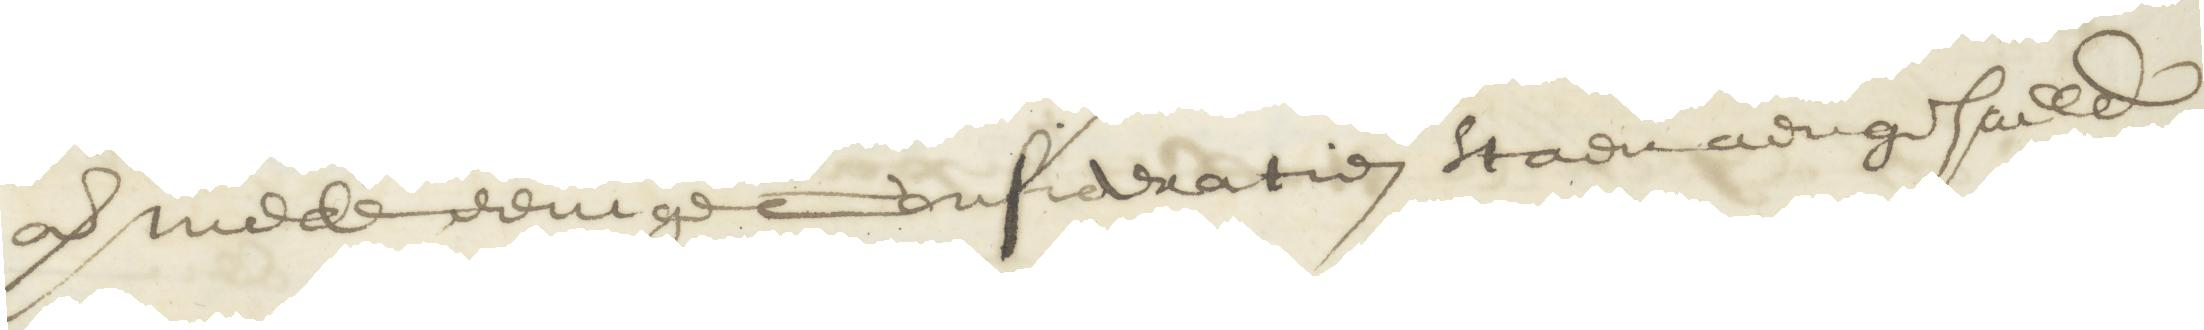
overmede eenige consideratien staen aengehaeld
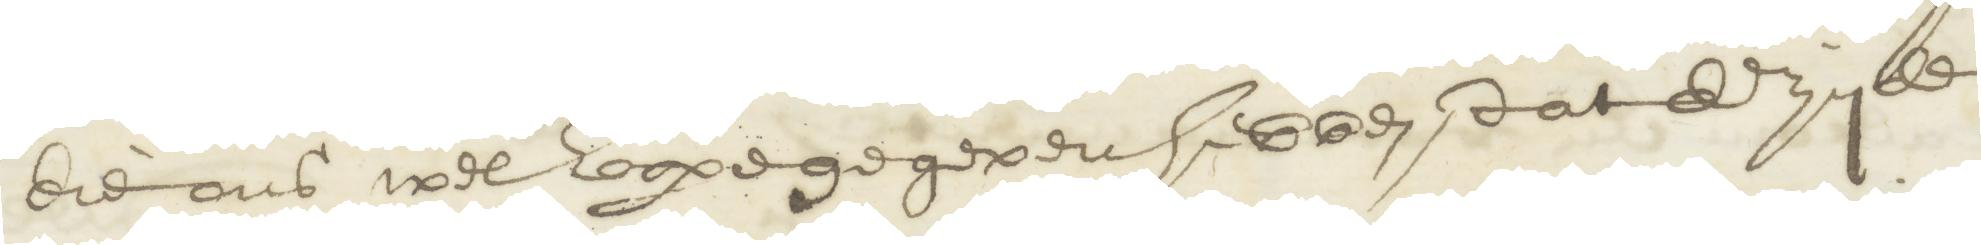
die ons wel hoope gegeven hebben, dat de zijde
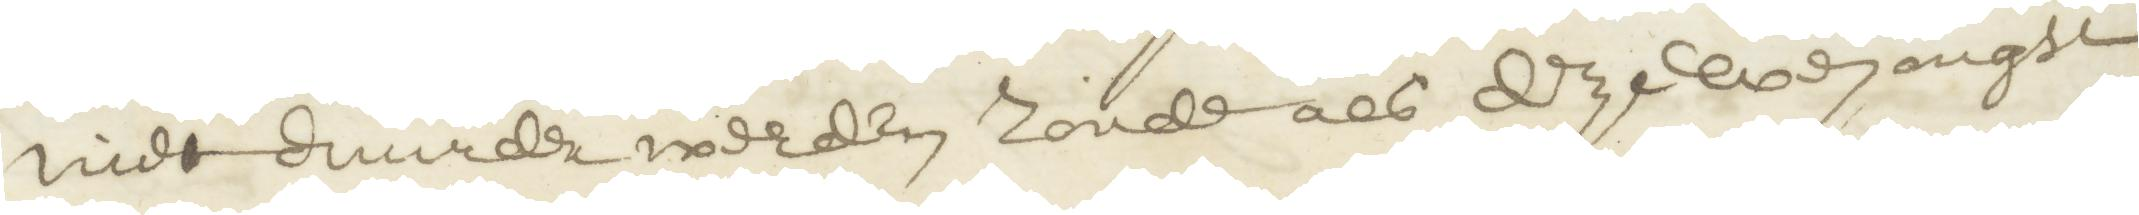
niet duurder werden Zoude als dezelve jongst
